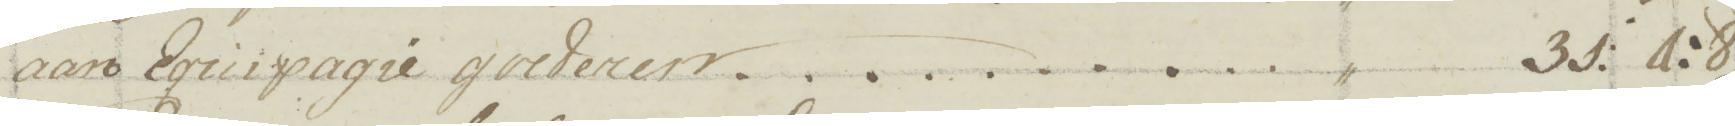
aan Equipagie goederen . . . . . - . . . . „ 31: 4:8
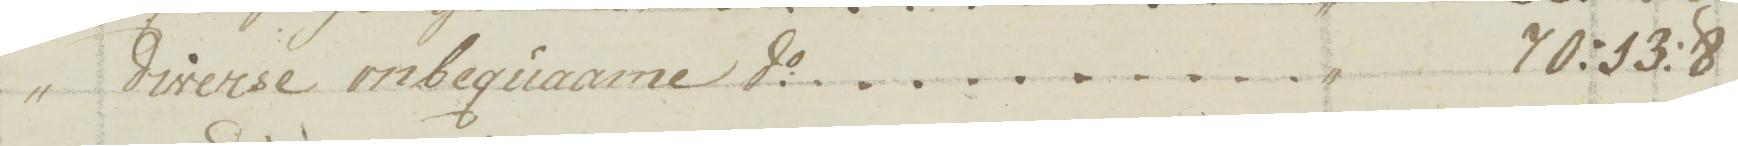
„ diverse onbequaame d:o . . . . . . . . - . „ 70:13:8
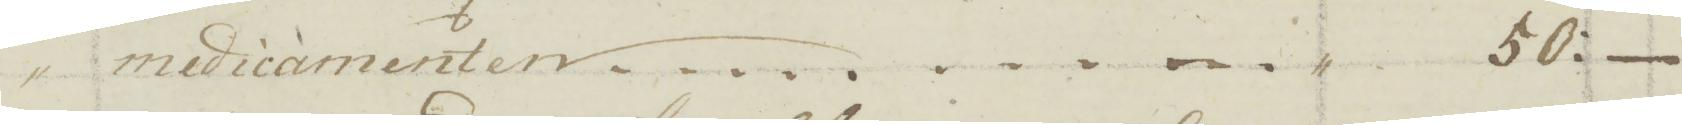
„ medicamenten - - . . . . . . . - . „ 50: —
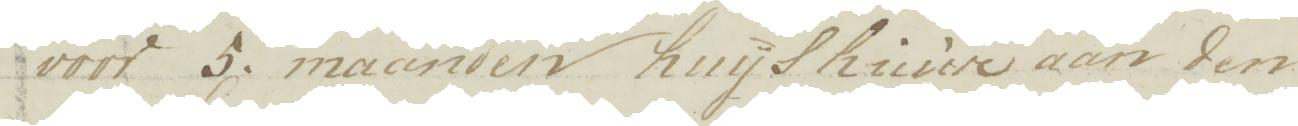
voor 5. maanden huijshuur aan den
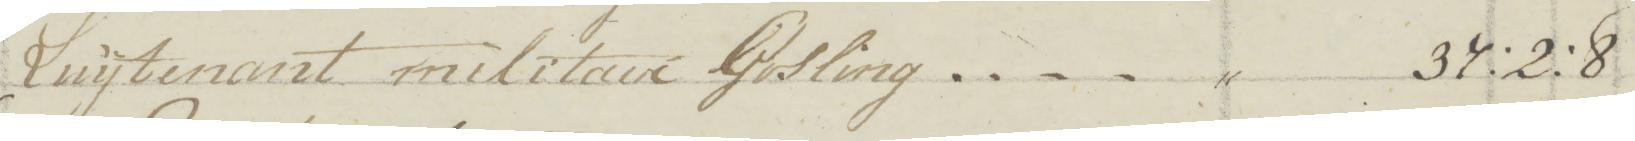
Luijtenant militair Gosling . . - - „ 37:2:8
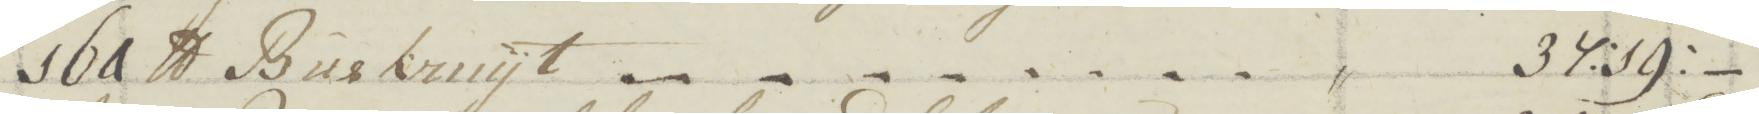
164 lb Buskruijt . - - - - - - - - „ 37:19: –
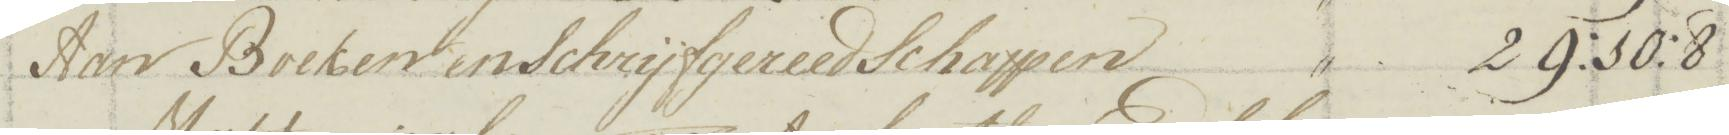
Aan Boeken en schrijfgereedschappen „ 29:10:8
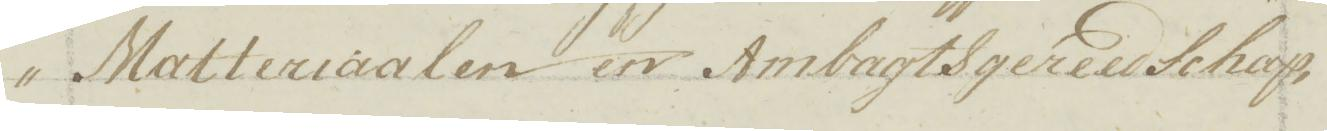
„ Matteriaalen en Ambagtsgereedschap„
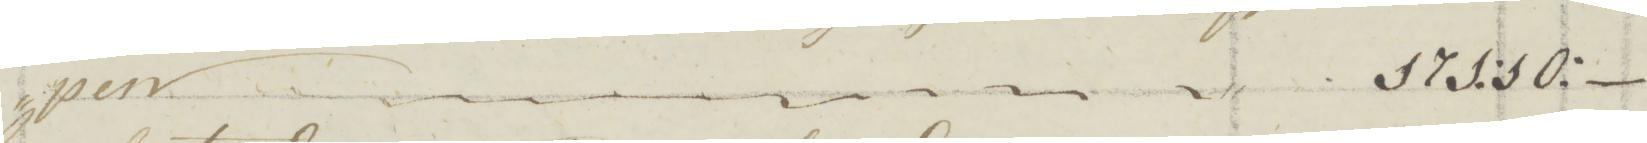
„pen - - - - - - - – – – – „ 171:10: —
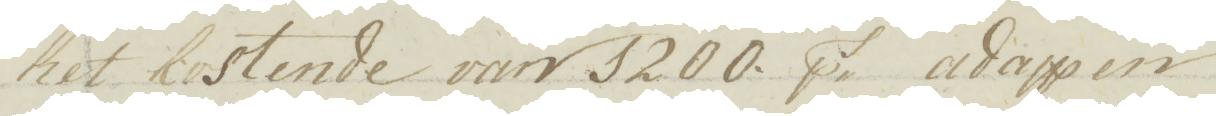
het kostende van 1200. p„s adappen
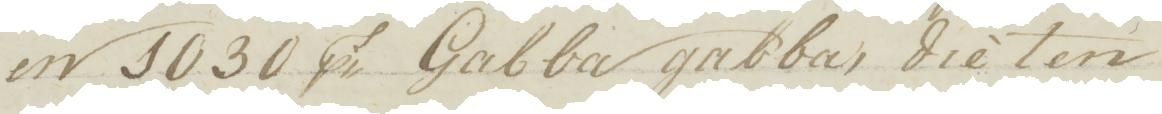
en 1030 p„s Gabba gabba, die ten
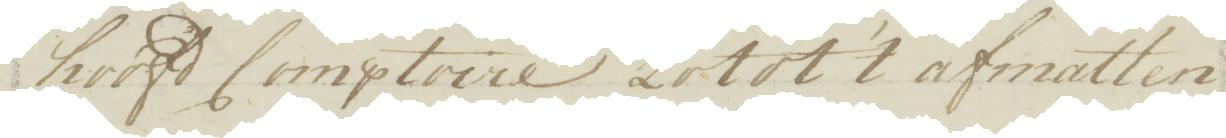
hoofd Comptoire zo tot ’t afmatten
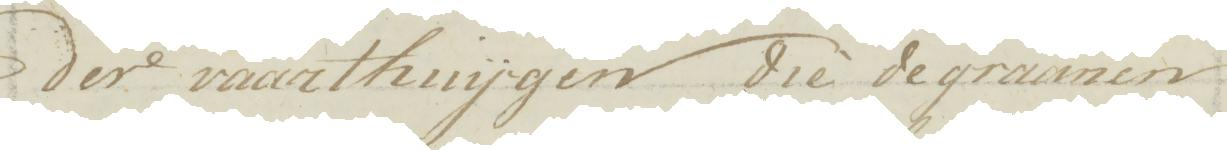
der vaarthuijgen die de graanen
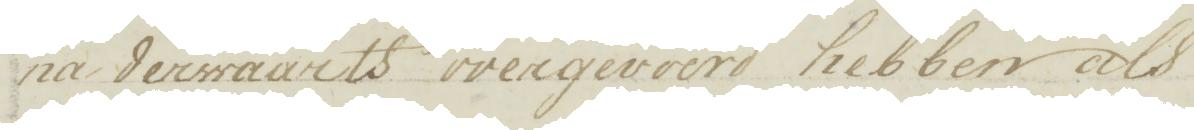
na derwaarts overgevoerd hebben als
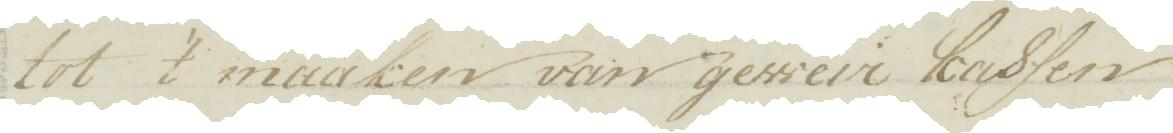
tot ’t maaken van geweir kassen
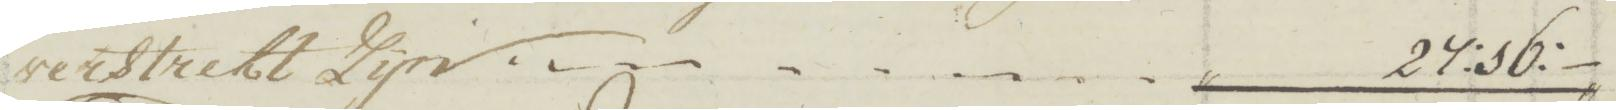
verstrekt zijn . – – – – - - . . . „ 27:16: –
